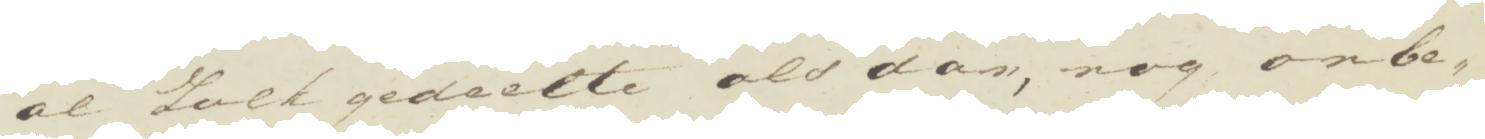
al zulk gedeelte als dan, nog onbe„
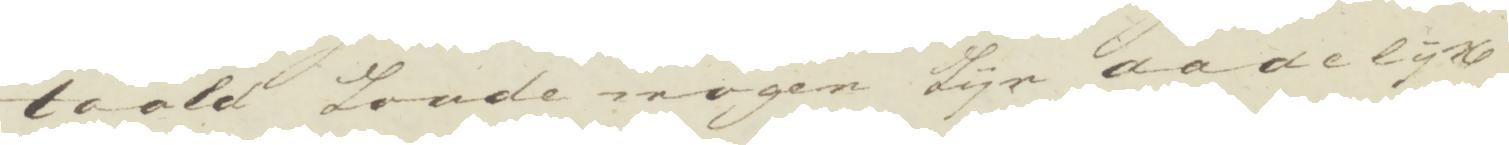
taald zoude mogen zijn dadelijk
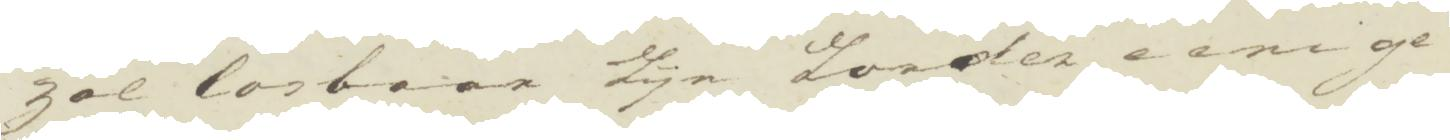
zal losbaar zijn zonder eenige
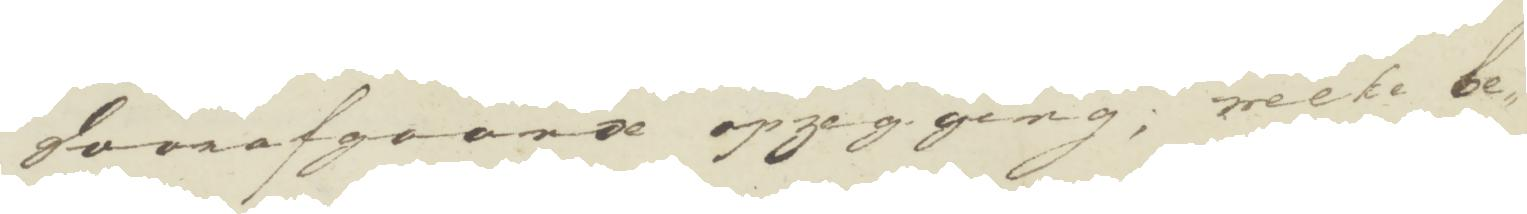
voorafgaande opzegging, welke be„
